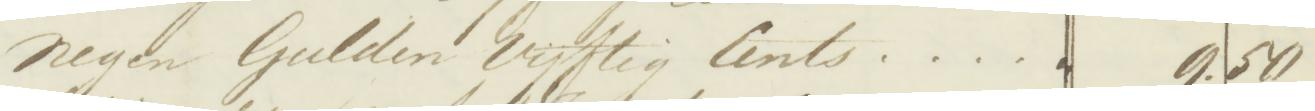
Negen Gulden vijftig Cents . . . . „ 9.50
